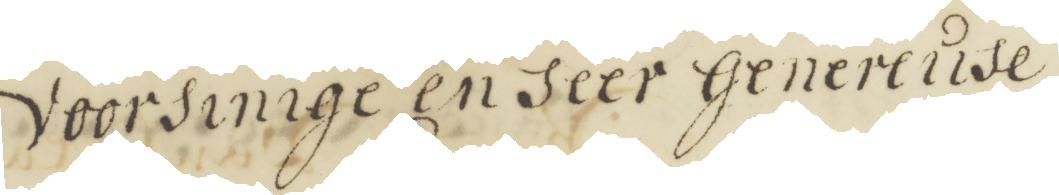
voorsinige en seer genereuse
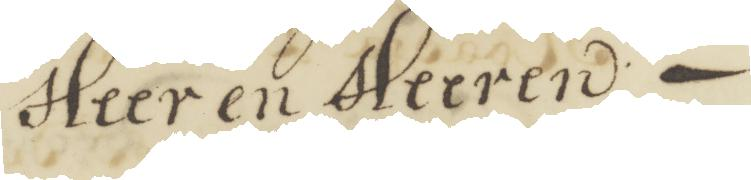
Heer en Heeren;-
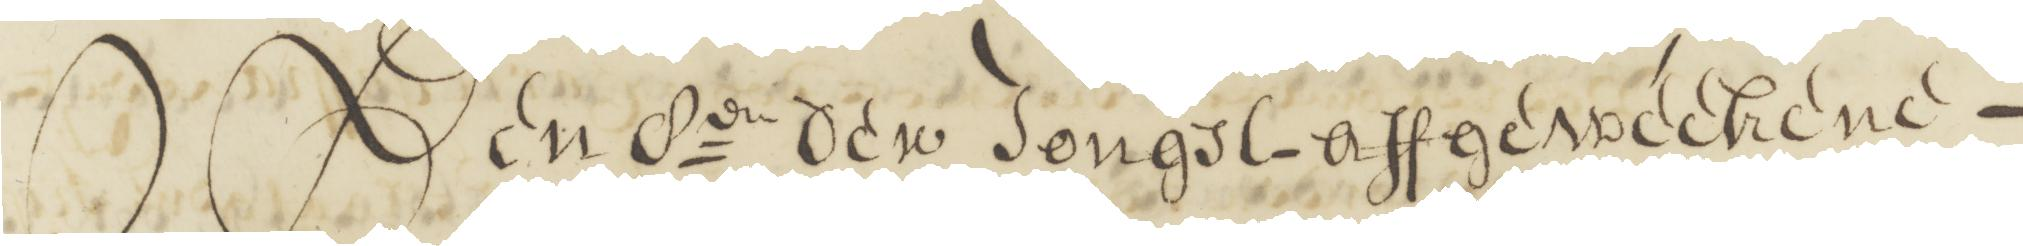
Den 8=en der Iongsl - affgeweekene-
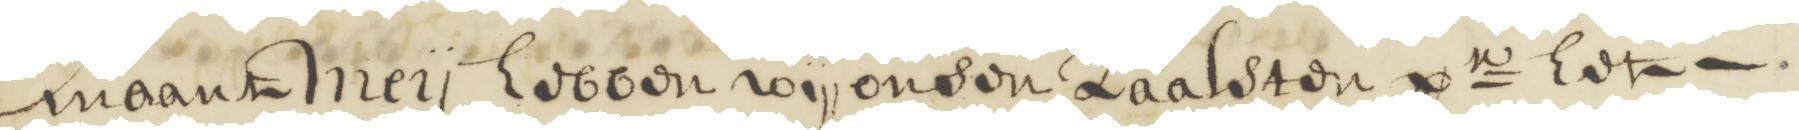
maant Meij hebben wij onsen Laatsten p=r het —.
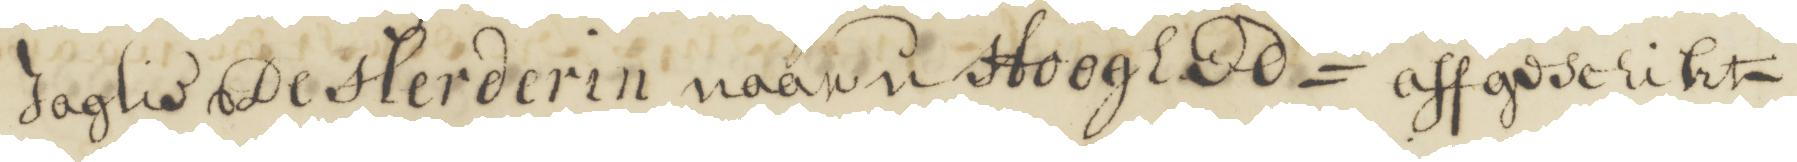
Iagtie De Herderin naar u Hoogh Ed=lens affgeschikt
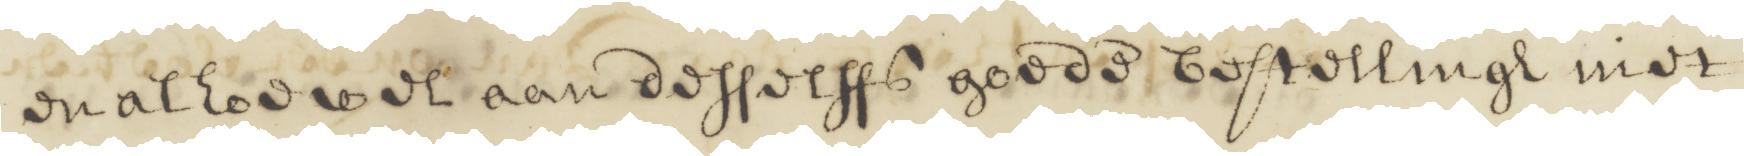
en alhoe wel aan desselffs goede bestellingh niet
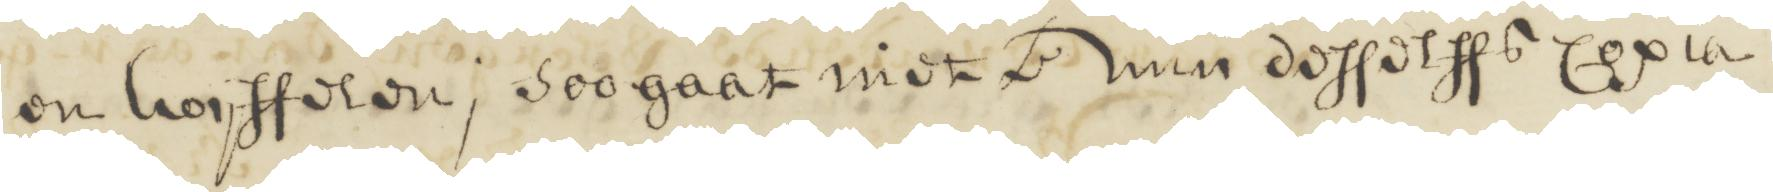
en twijffelen; soo gaat niet te min desselffs Copia
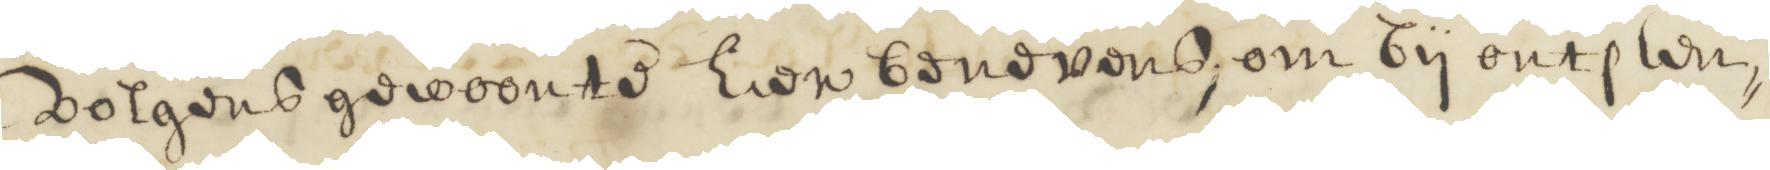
Volgens gewoonte hier benevens, om bij ontsten,
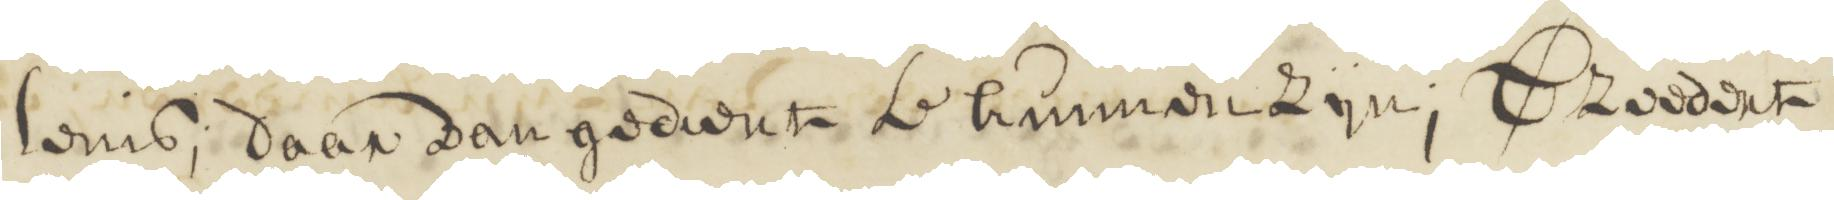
tenis; daar van gedient te kunnen zijn; T Zeedert
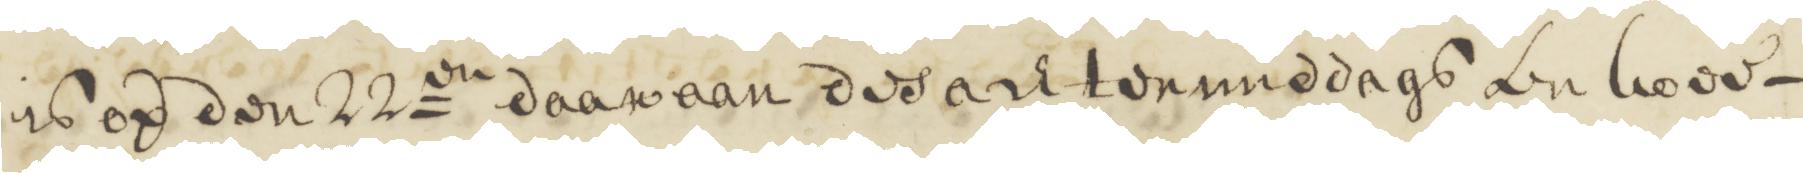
is op den 22=en daar aan des achtermiddags ten twee-
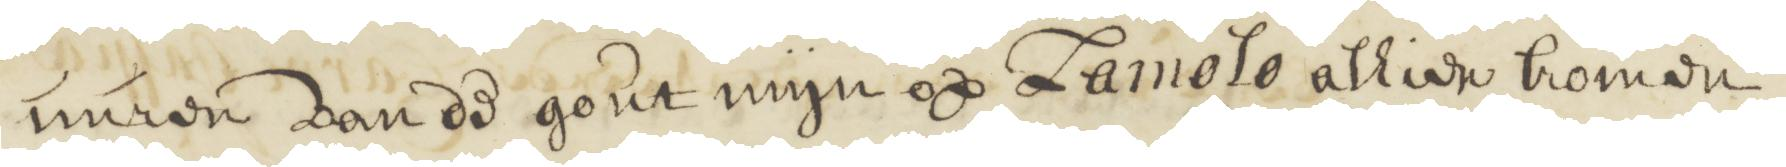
uuren van de gout mijn op Lamolo alhier komen
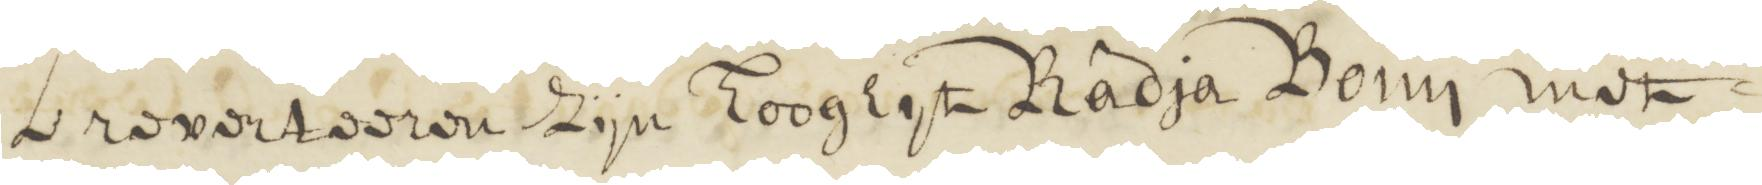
te reverteeren Zijn hooghijt Radja Bonij met
